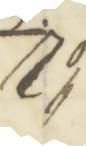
r„o
